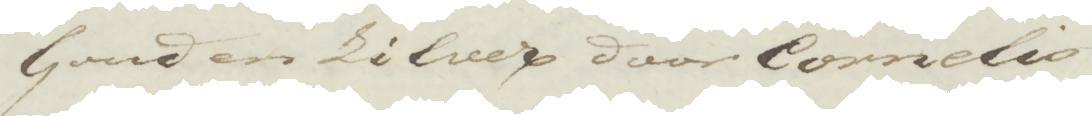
Goud en zilver door Cornelis
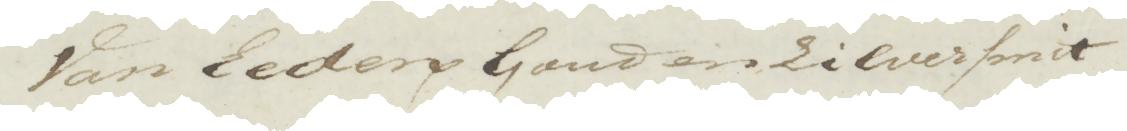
van Eeden Goud en Zilversmit
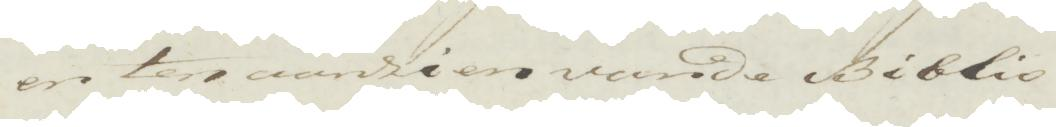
en ten aanzien vande Biblio
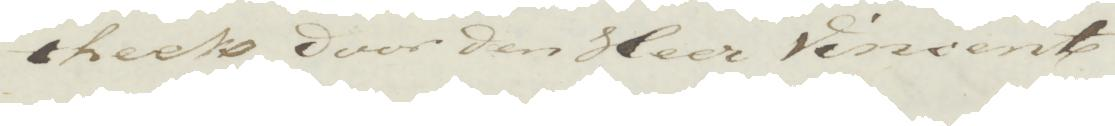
cheek door den Heer Vincent
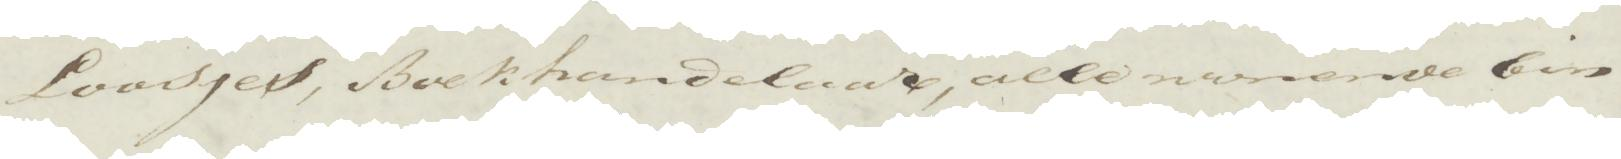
Loosjes, Boekhandelaar, alle wonende bin
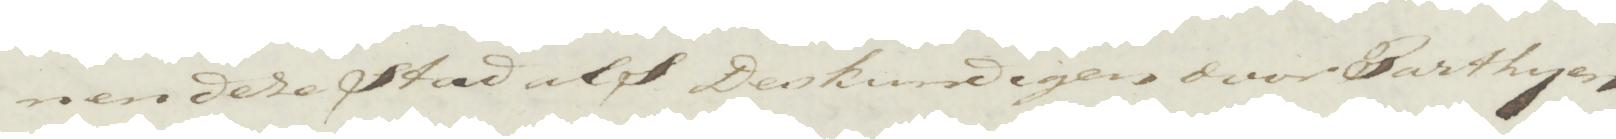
nen deze Stad als Deskundigen door Parthyen
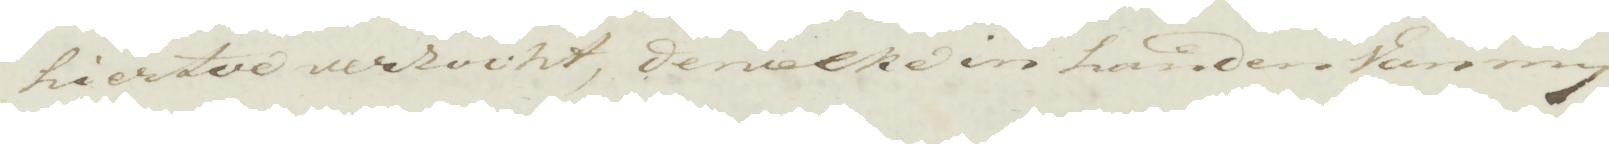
hiertoe verzocht, dewelke in handen Van my
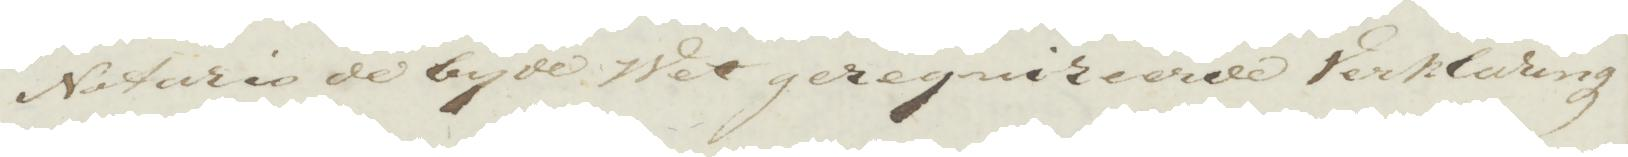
Notaris de by de Wet gerequireerde Verklaring
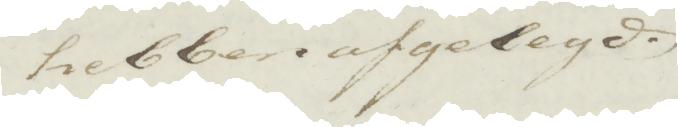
hebben afgelegd.
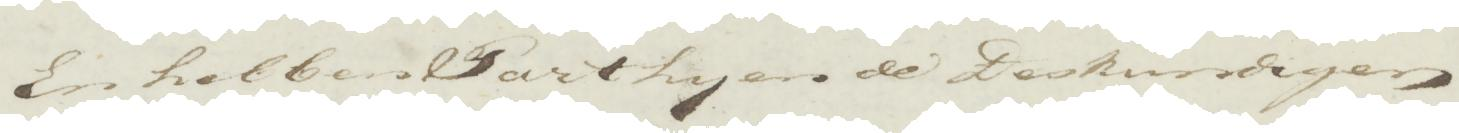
En hebben Parthyen de Deskundigen
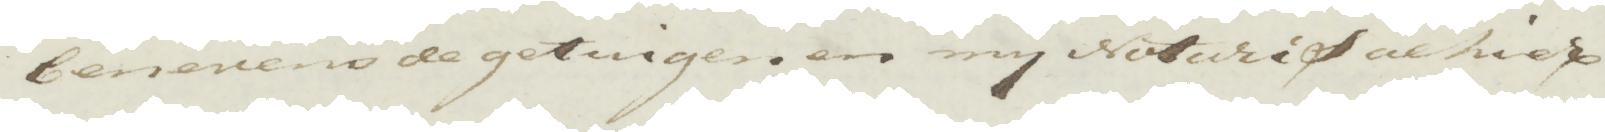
benevens de getuigen en my Notaris alhier
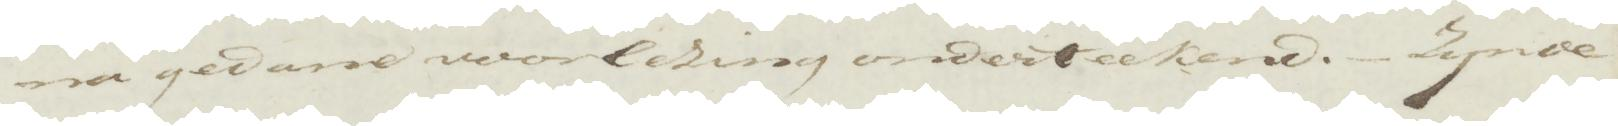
na gedane voorlezing onderteekend. — zijnde
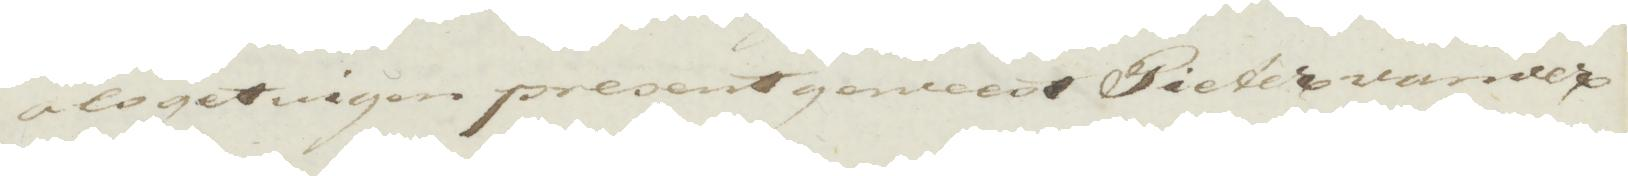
als getuigen present geweest Pieter van der
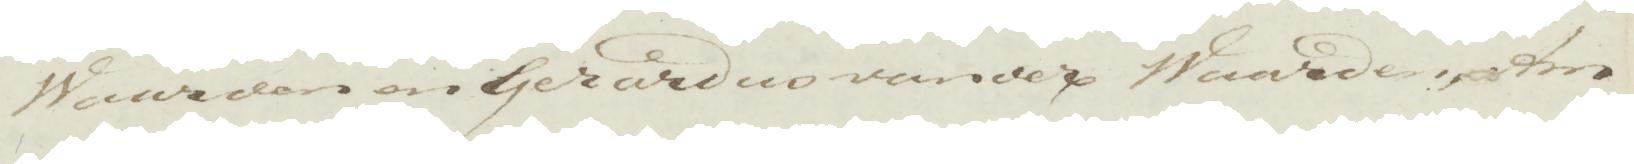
Waarden en Gerardus van der Waarden, Am
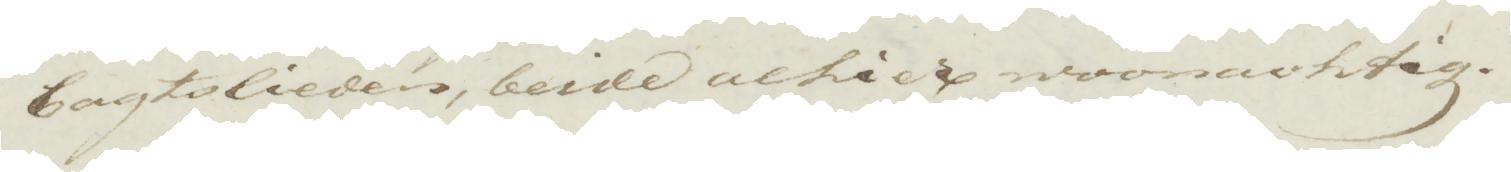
bagtslieden, beide alhier voonachtig.
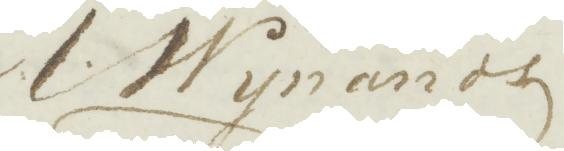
A Wynands
